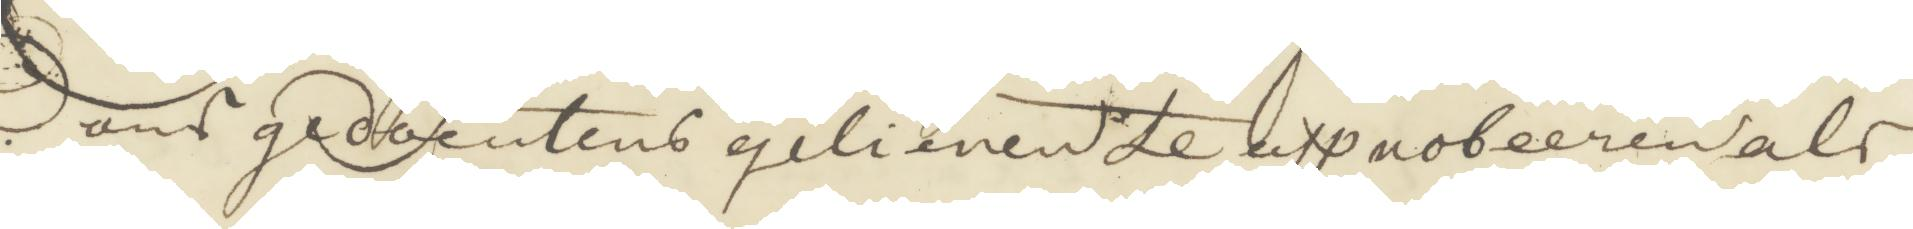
ons gedoentens gelieven te approbeeren als
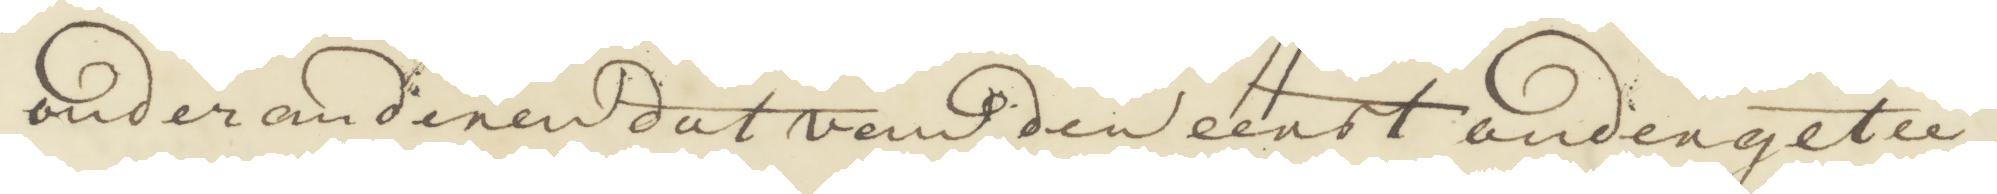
onder anderen dat van den eerst ondergetee
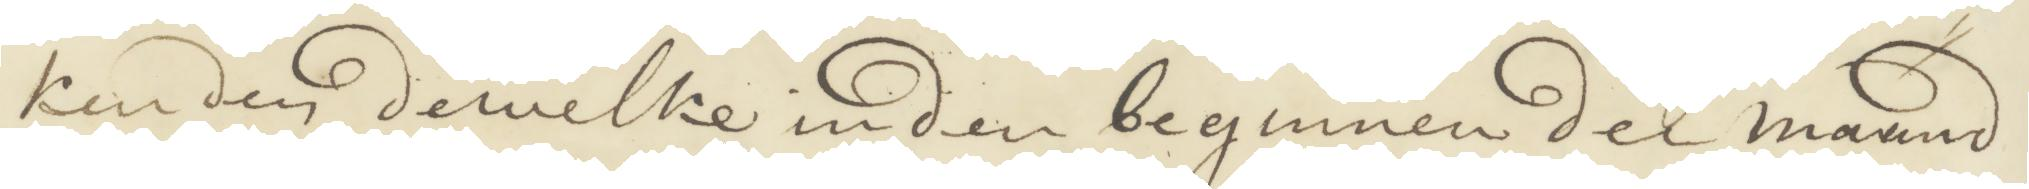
kenden, dewelke in den beginnen der maand
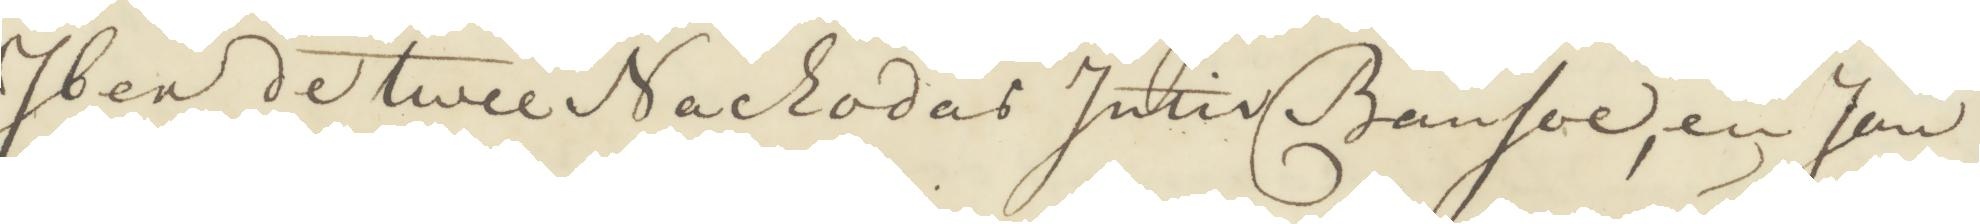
Jber de twee Nachodas Jntie Bansoe, en Jan
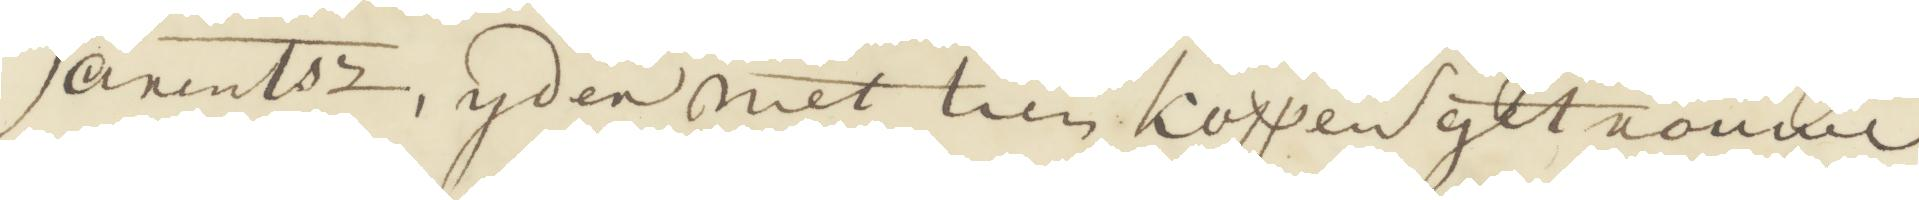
arentsz, yder met tien koppen getrouwe
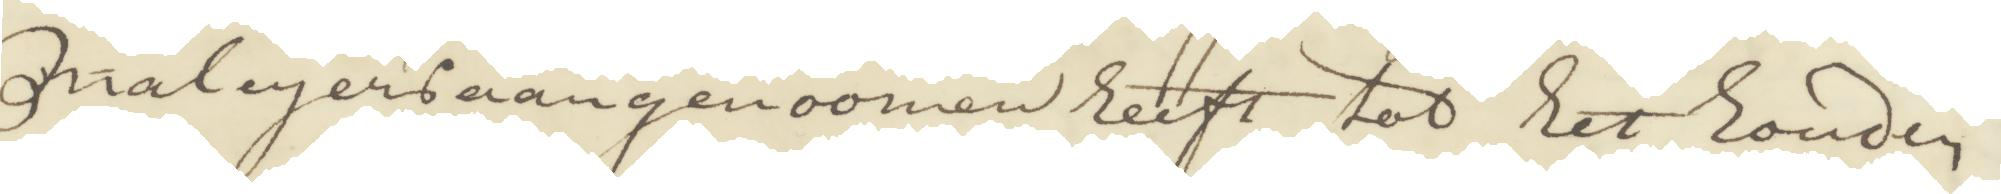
maleijers aangenoomen heeft tot het houden
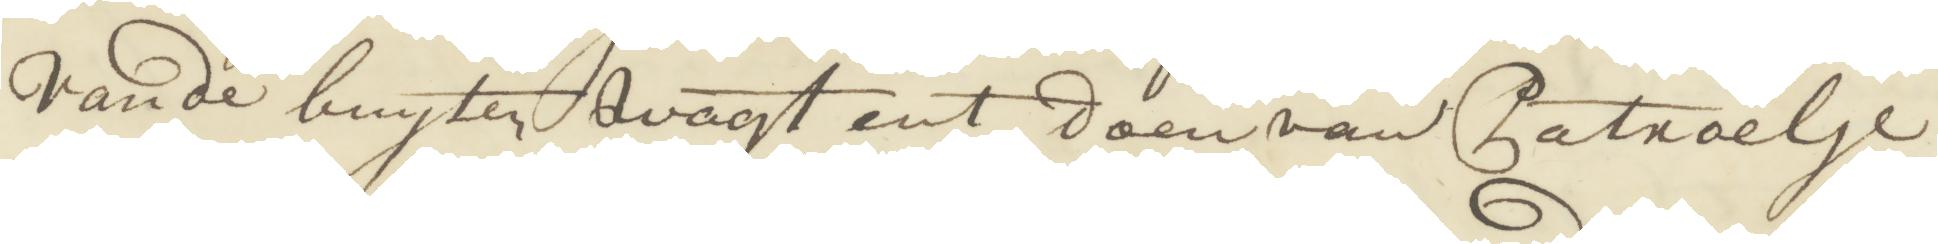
van de buijten wagt ent doen van Patroelje
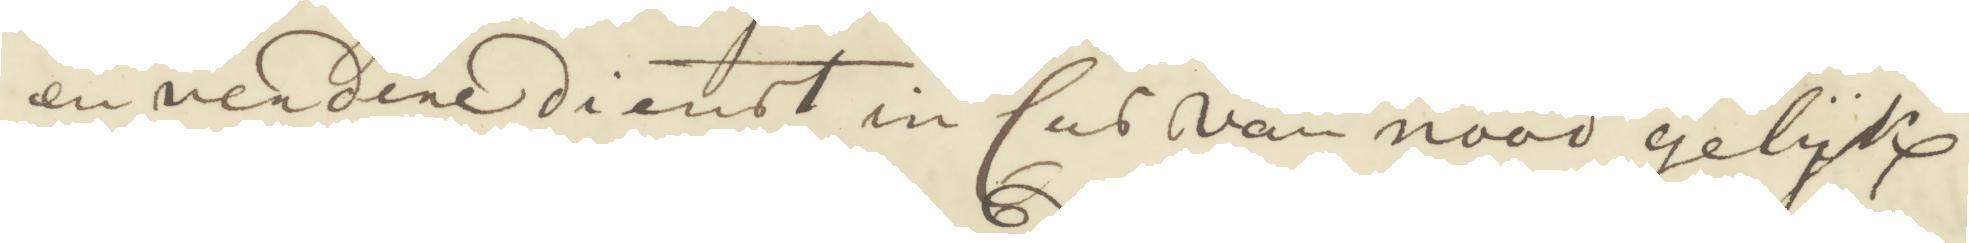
en verdere dienst in Cas van nood gelijk
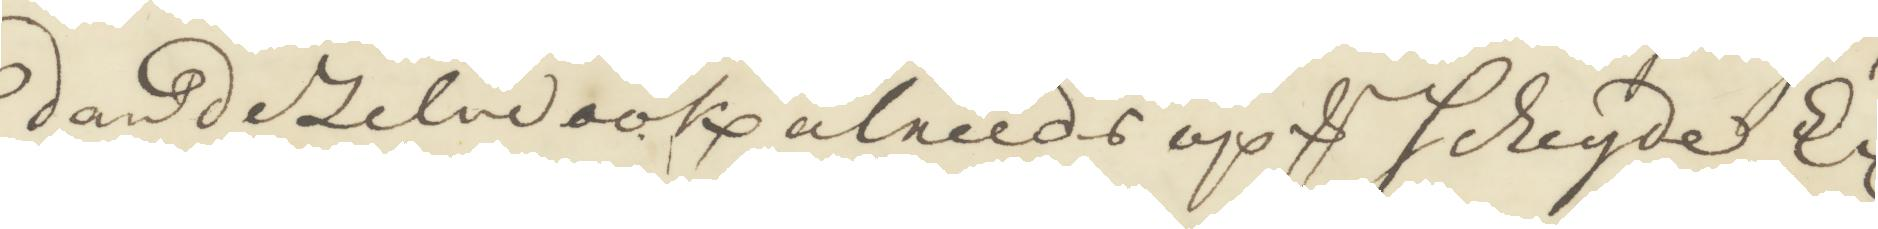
dan dezelve ook alreeds op verscheyde Ex
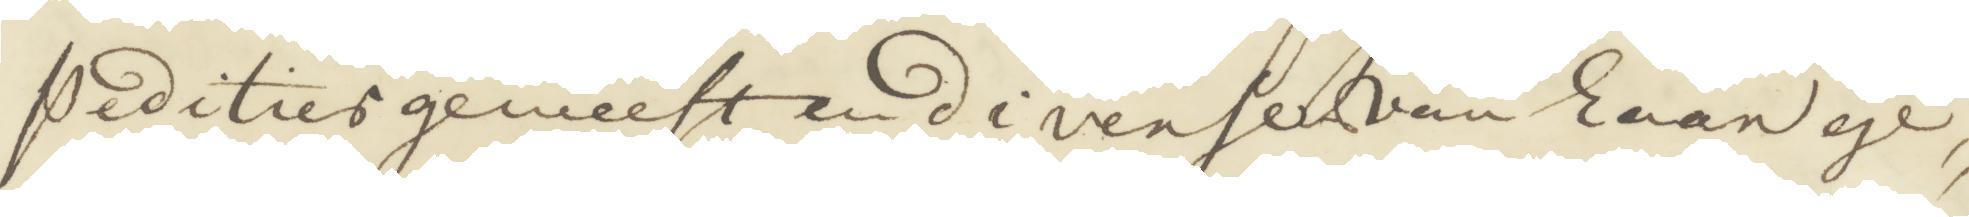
pedities geweest en diverse van haar ge„
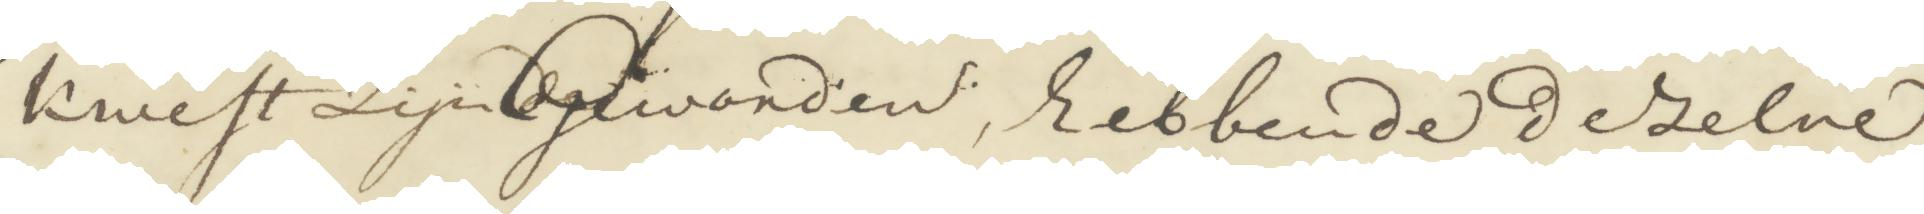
kwest zijn geworden, hebbende dezelve
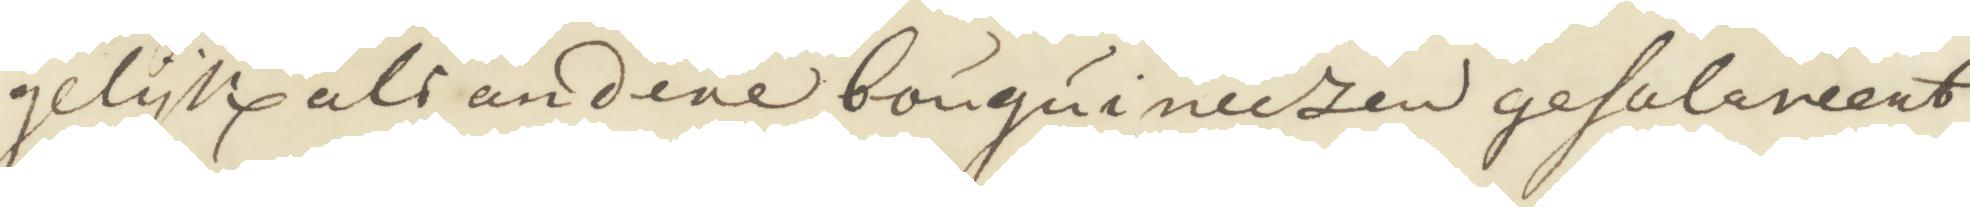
gelijk als andere bouguineezen gesalareert
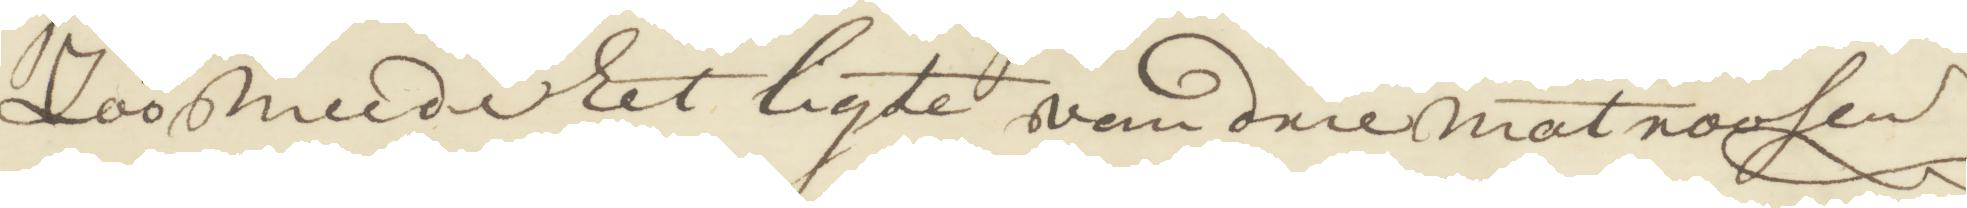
zoo meede het ligte van drie matroosen
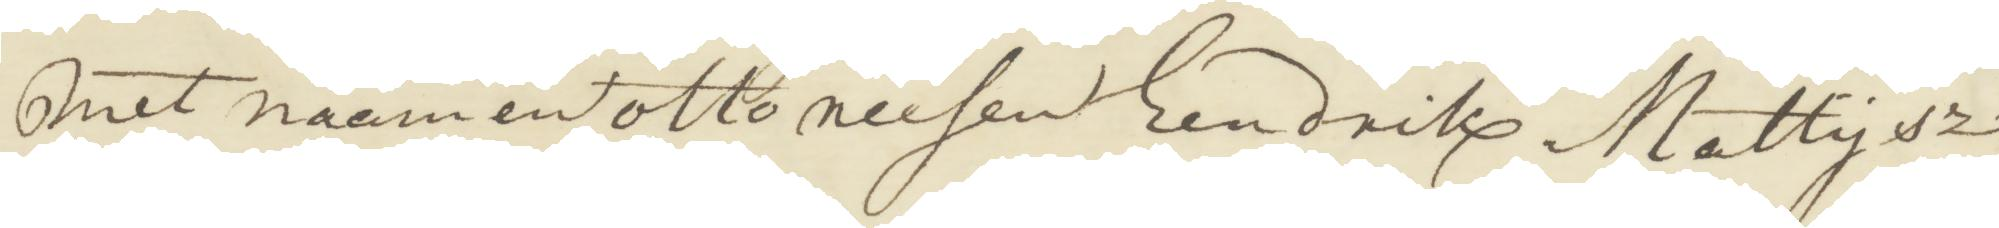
met naamen otto neesen hendrik Mattijsz
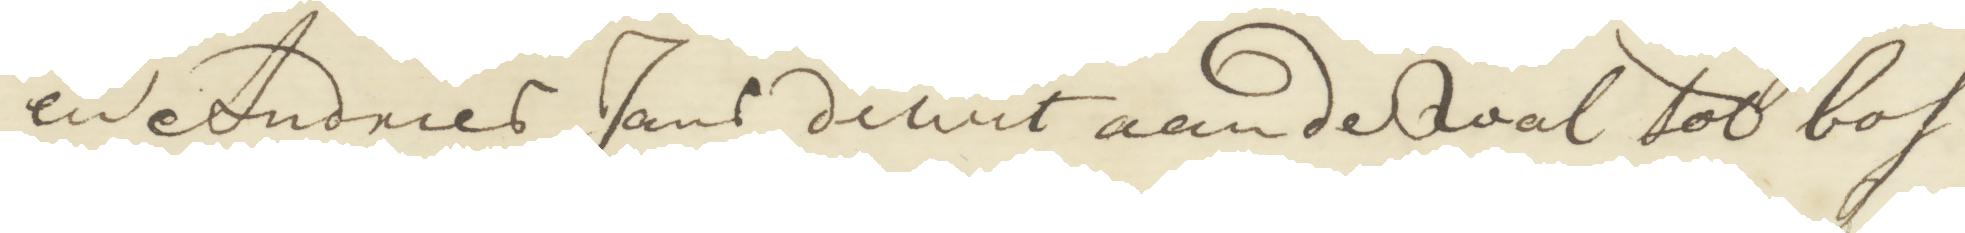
en Andries Jans dewit aan de wal tot bos
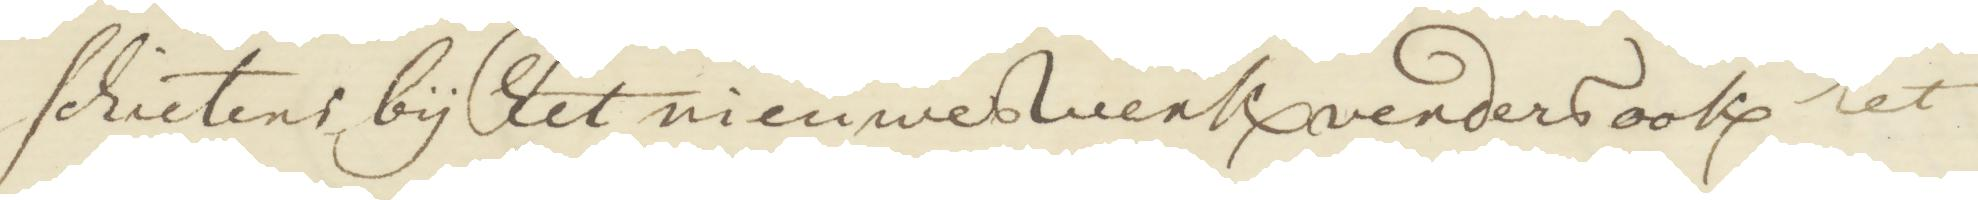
schieters bij het nieuwe werk verders ook het
